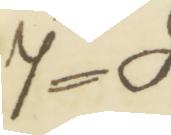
7='
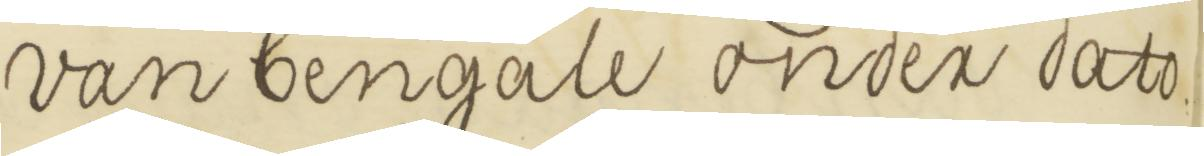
van bengale onder dato
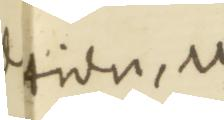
tien,
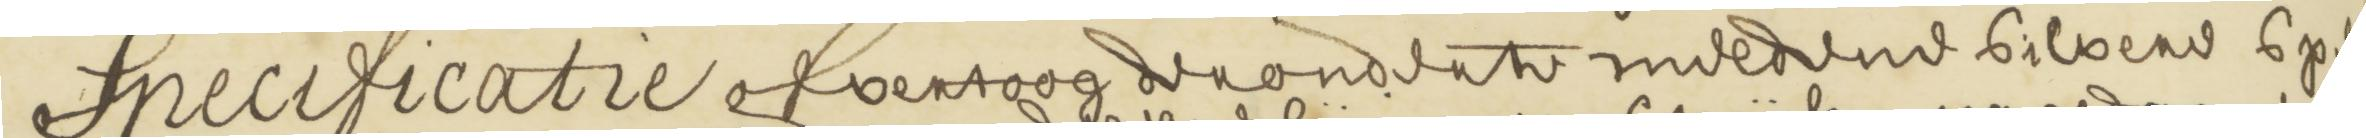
Specificatie of vertoog der onder te meldene silvere spe„
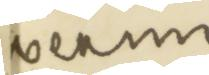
verm
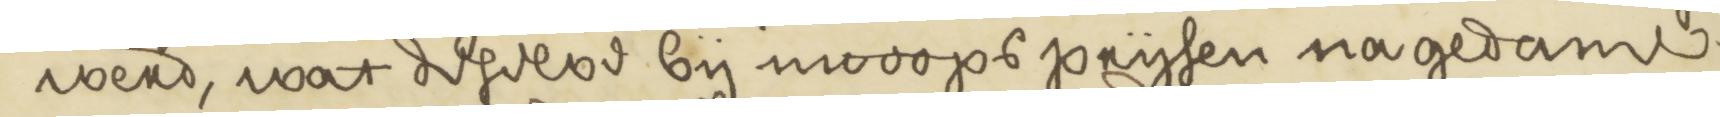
werd, wat deselve bij incoops prijsen na gedane
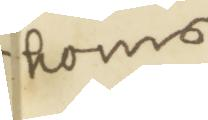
koms
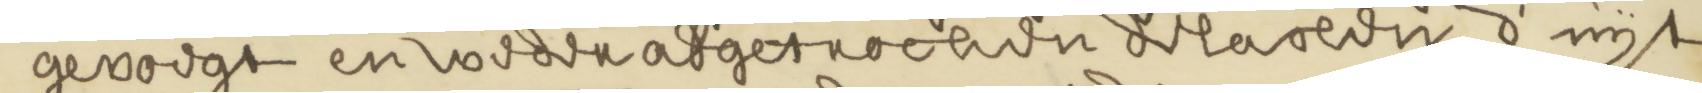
gevoegt en weder afgetrocken de lasten, d’ uijt
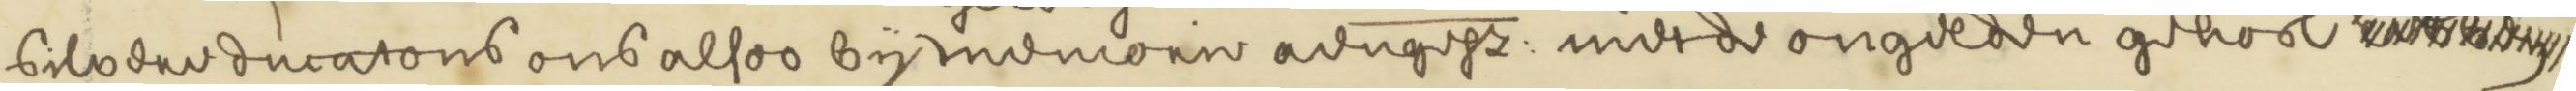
silvere ducatons ons alsoo bij memorie aengesz: met de ongelden gekost hebben
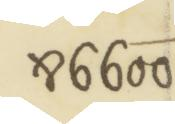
86600
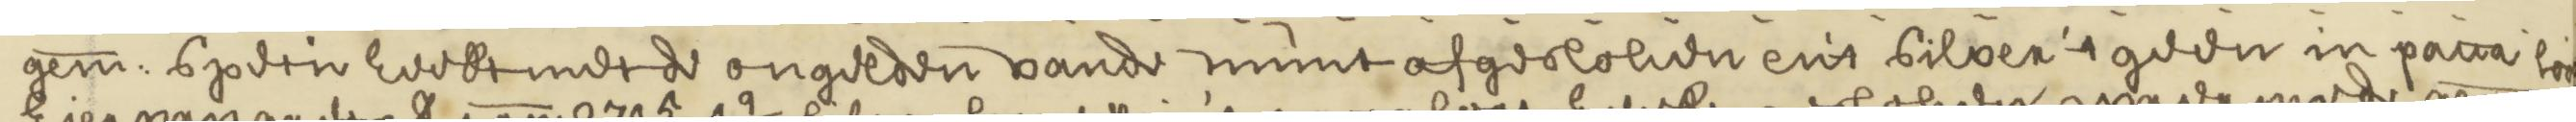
gem: specie heeft met de ongelden vande munt afgesloken en’t silver ’t geen in pacca soo
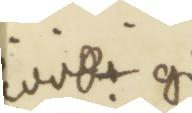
heeft g
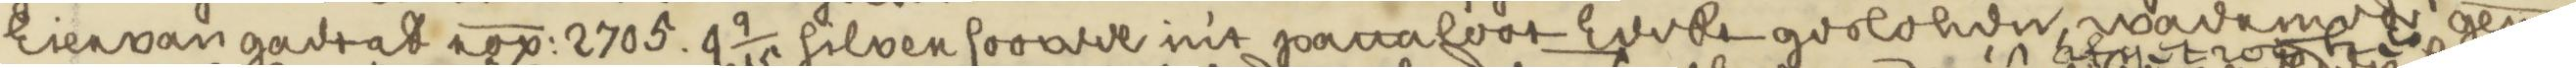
hiervan gaet af rop: 2705. 4 9/15. silver sooveel in’t paccaloot heeft gesloken, waermede gem:
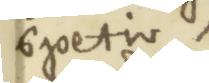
spetie
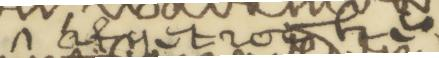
^ afgetrocke
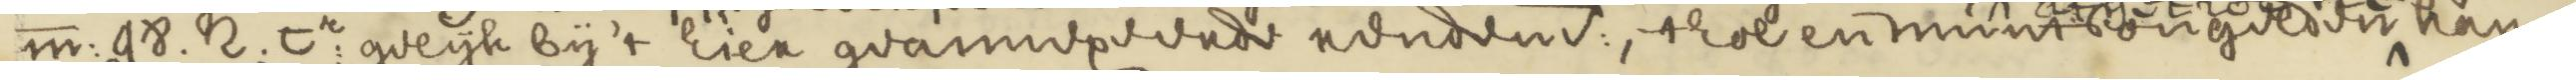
m: 48. 2. c:r gelijk bij ’t hier geannexeerde rendem:t, thol en munts ongelden ^ kan
